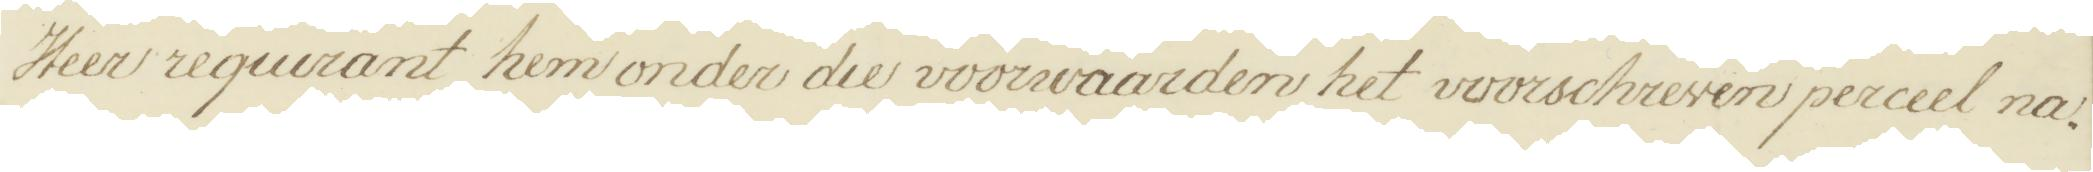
Heer requirant hem onder die voorwaarden, het voorschreven perceel na„
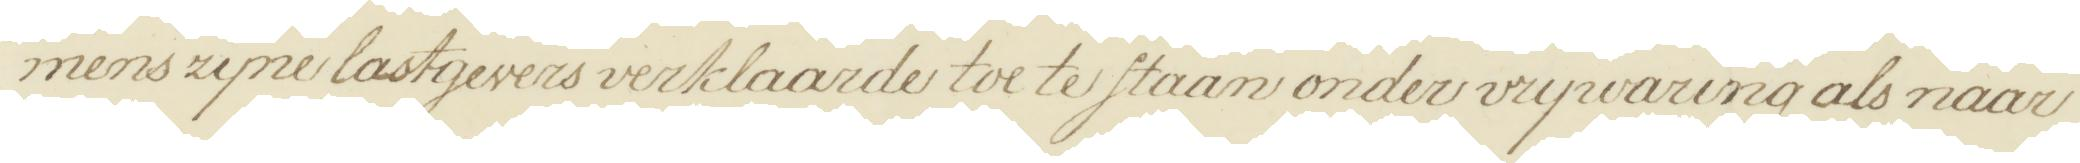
mens zyne lastgevers verklaarde toe te staan onder vrywaring als naar
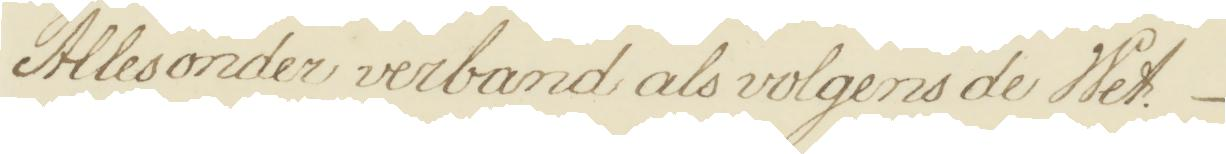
Alles onder verband, als volgens de Wet.-
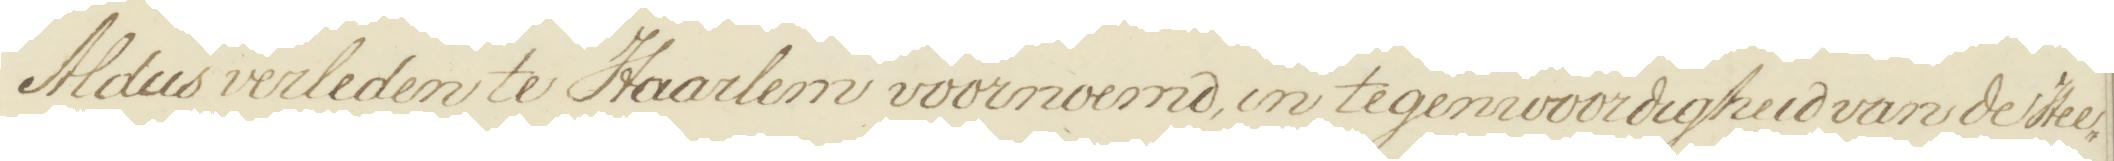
Aldus verleden te Haarlem voornoemd, in tegenwoordigheid van de Heer
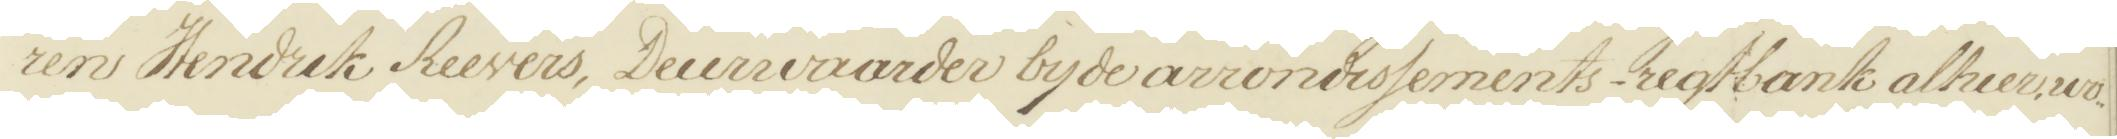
ren Hendrik Reevers, Deurwaarder by de arrondissements -regtbank alhier, wo„
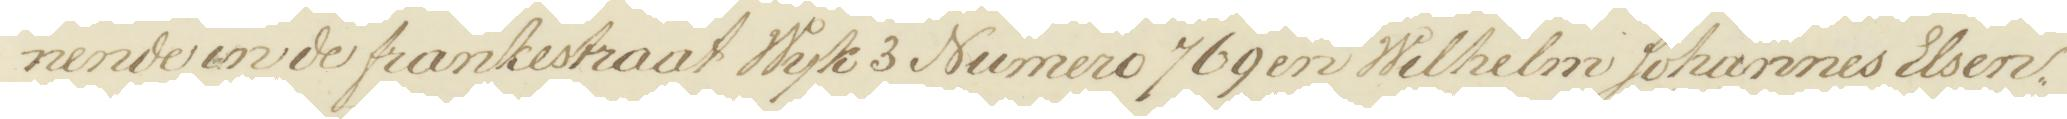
nende in de frankestraat Wyk 3 Numero 769 en Wilhelm Johannes Elsen„
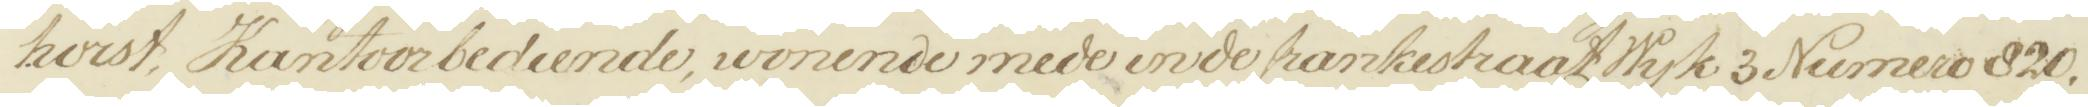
horst, Kantoorbediende, wonende mede in de frankestraat Wyk 3 Numero 820.
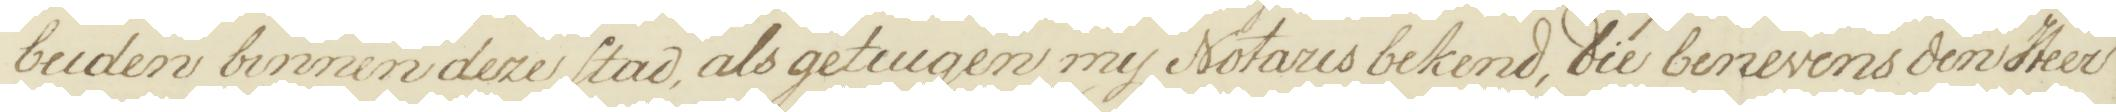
beiden binnen deze Stad, als getuigen my Notaris bekend, die benevens den Heer
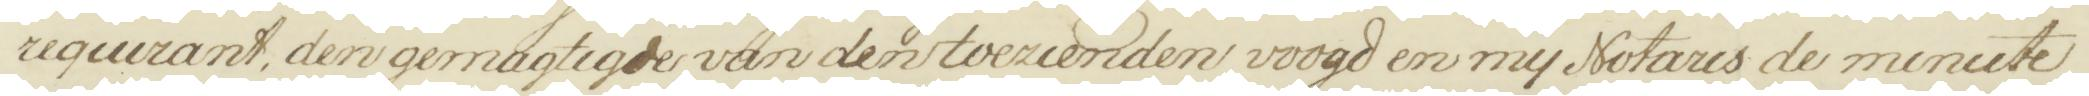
requirant, den gemagtigde van den toezienden voogd en my Notaris de minute
